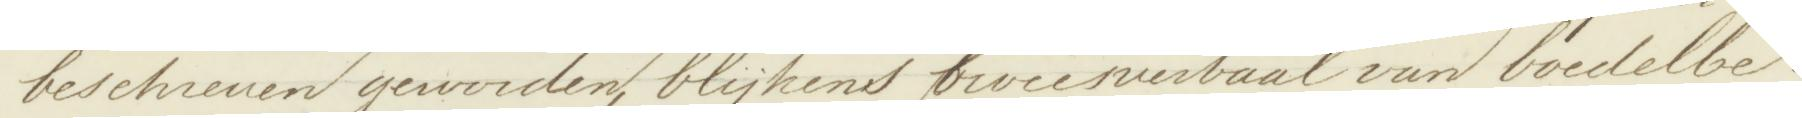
beschreven geworden, blijkens proces verbaal van boedelbe
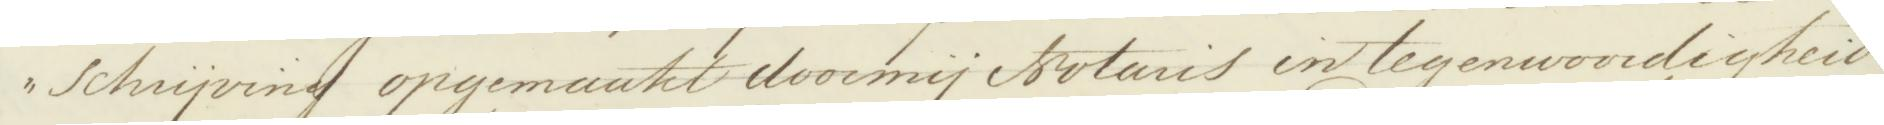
„schrijving opgemaakt doormij Notaris in tegenwoordigheid
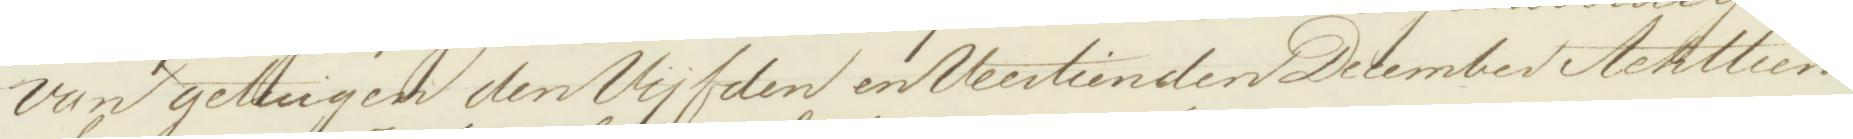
van getuigen den Vijfden enVeertienden December Achttien
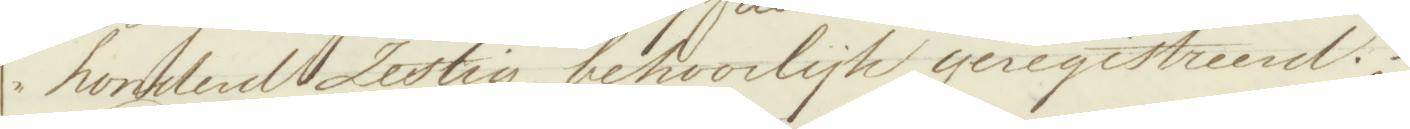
honderd Zestig behoorlijk geregistreerd.
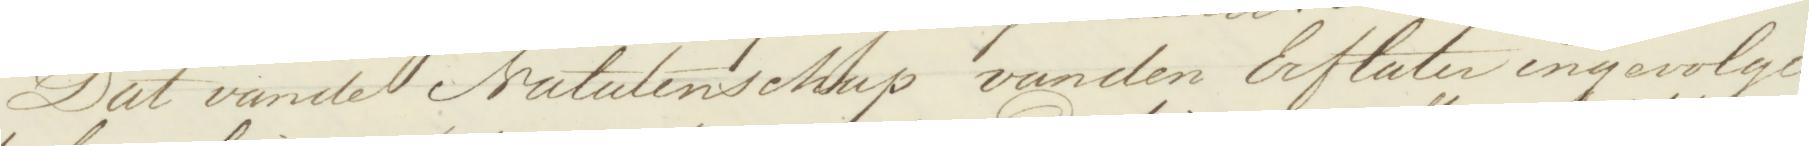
Dat vande Nalatenschap vanden Erflater ingevolge
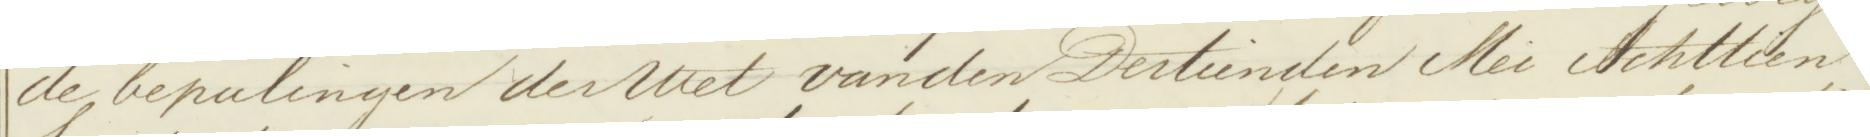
de bepalingen derWet vanden Dertienden Mei Achttien
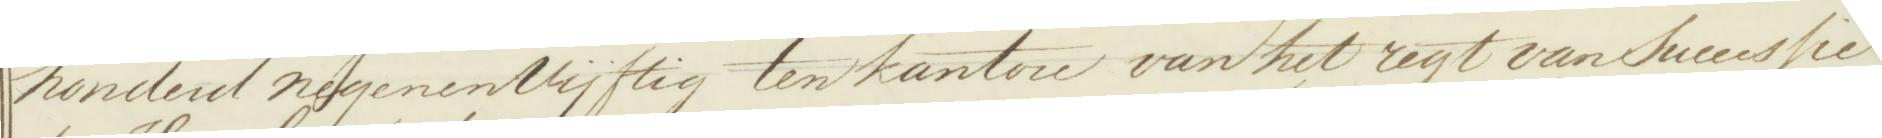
honderd negenenvijftig ten kantore van het regt van Successie
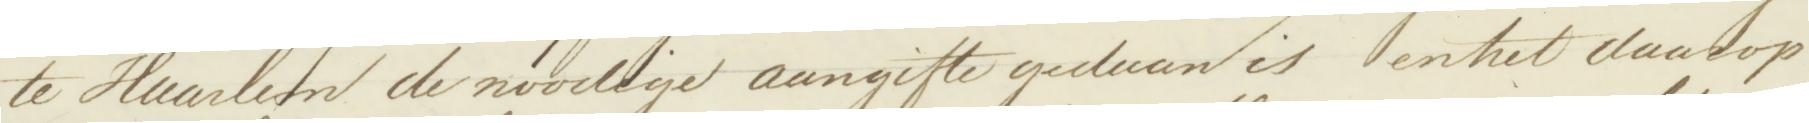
te Haarlem de noodige aangifte gedaan is enhet daarop
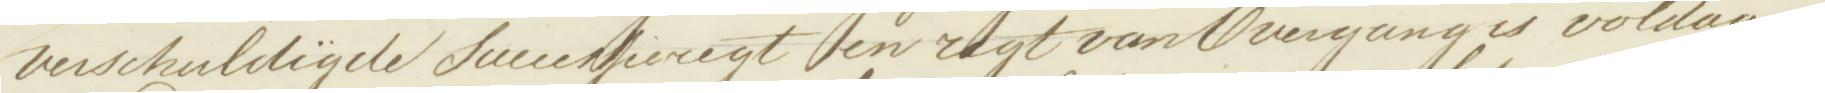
verschuldigde successieregt en regt vanOvergang is voldaan
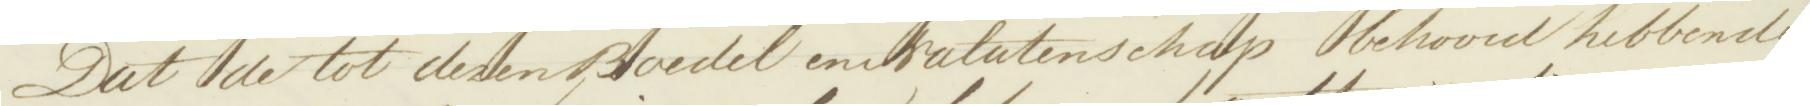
Dat de tot dezen Boedel enNalatenschap behoord hebbende
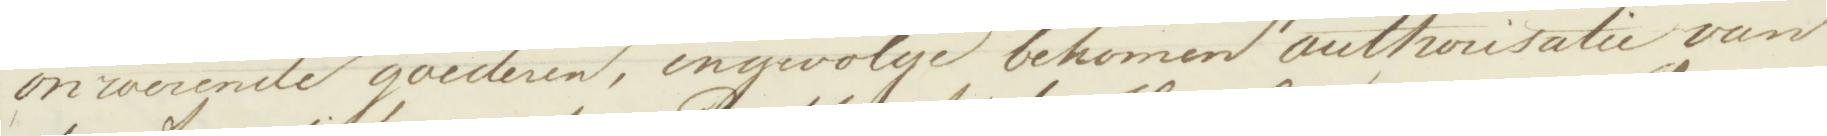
onroerende goederen, ingevolge bekomen authorisatie van
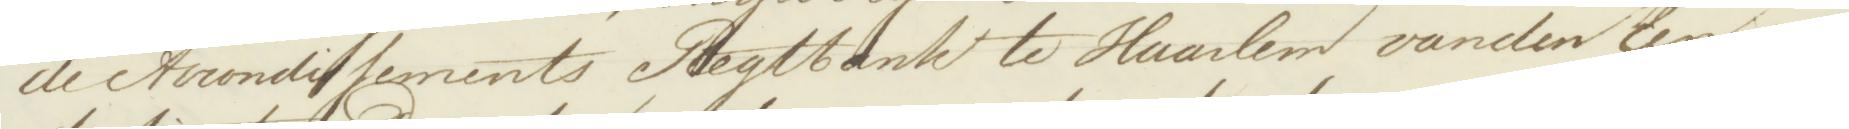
de Arrondissements Regtbank te Haarlem vanden Een en
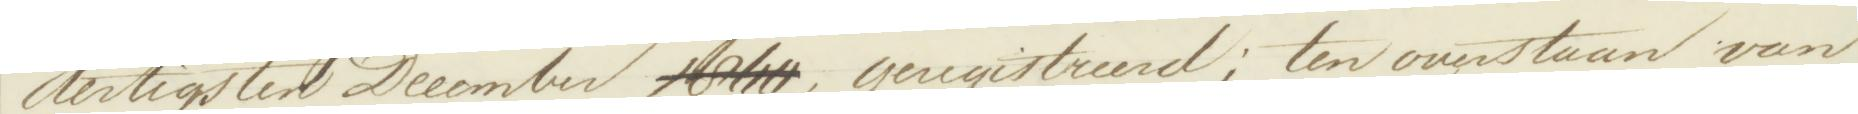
dertigsten December 1860, geregistreerd; ten overstaan van
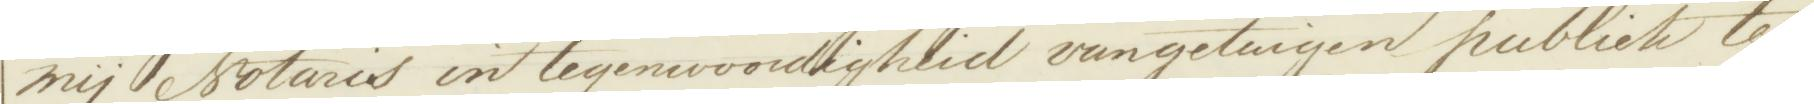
mij Notaris in tegenwoordigheid vangetuigen publiek te
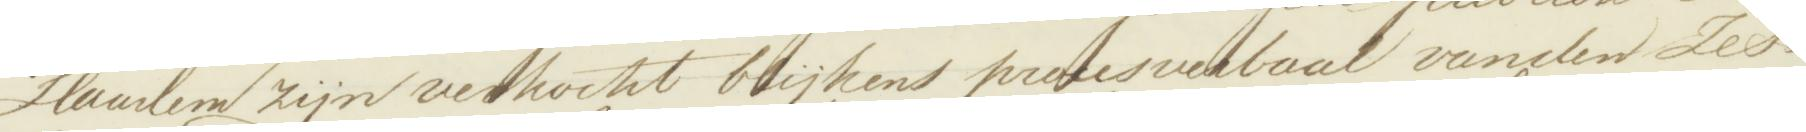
Haarlem zijn verkocht blijkens proces verbaal vanden Zes„
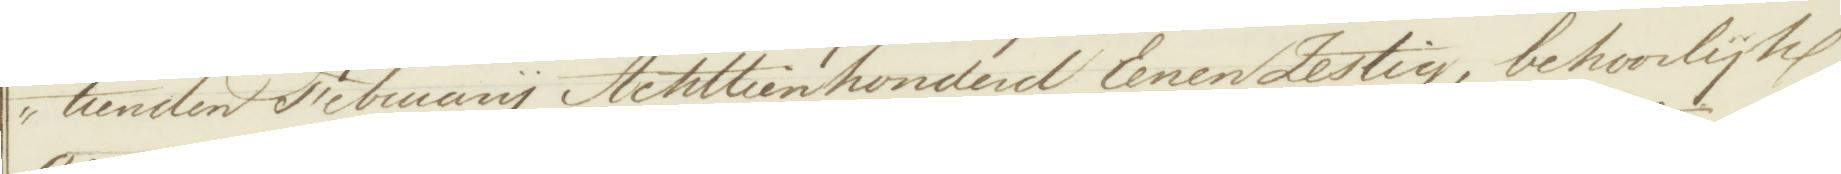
„tienden Februarij Achttienhonderd Eenen Zestig, behoorlijk
